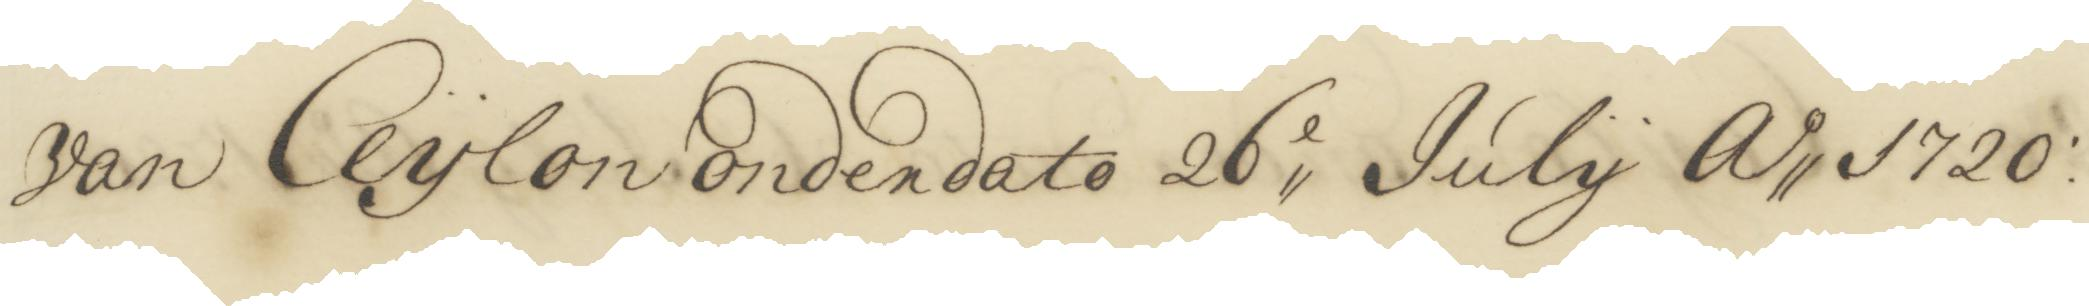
van Ceijlon onder dato 26„e Iulij A„o 1720:
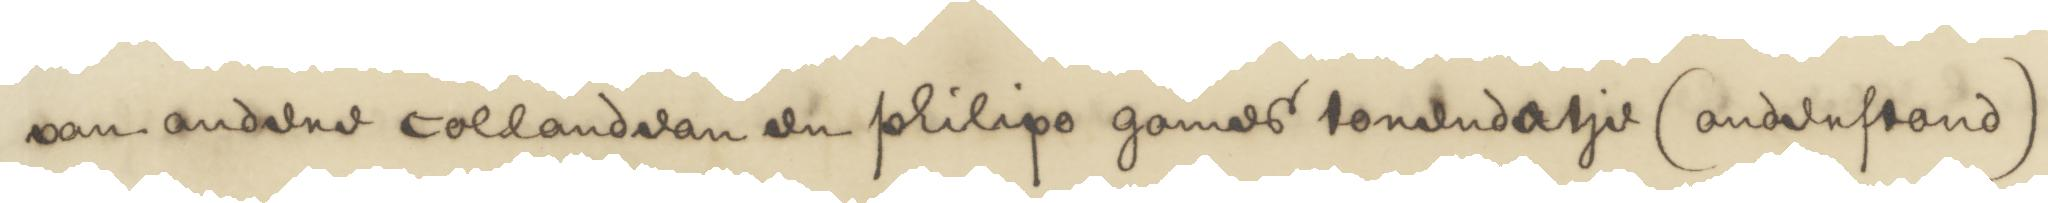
van andere collandean en philipo gomes torendatje (onderstond)
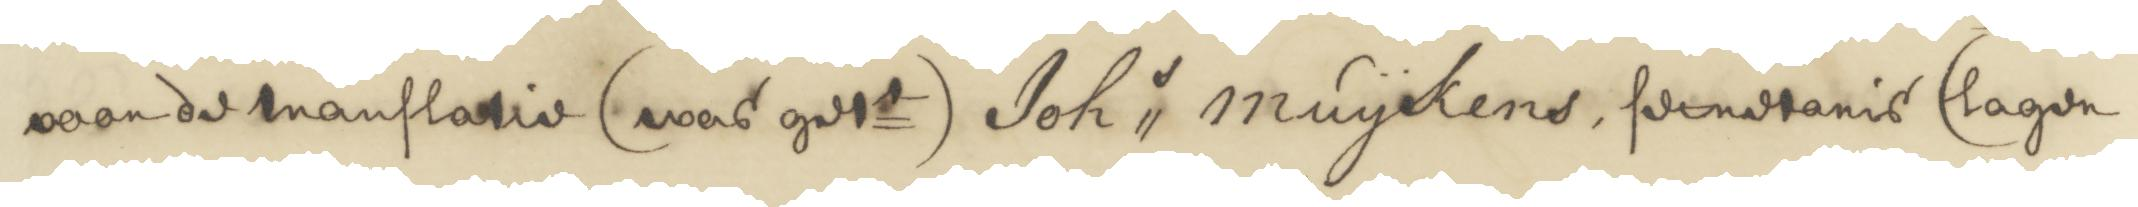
voor de translatie (was get=t) Ioh„s muijkens, secretaris (lager
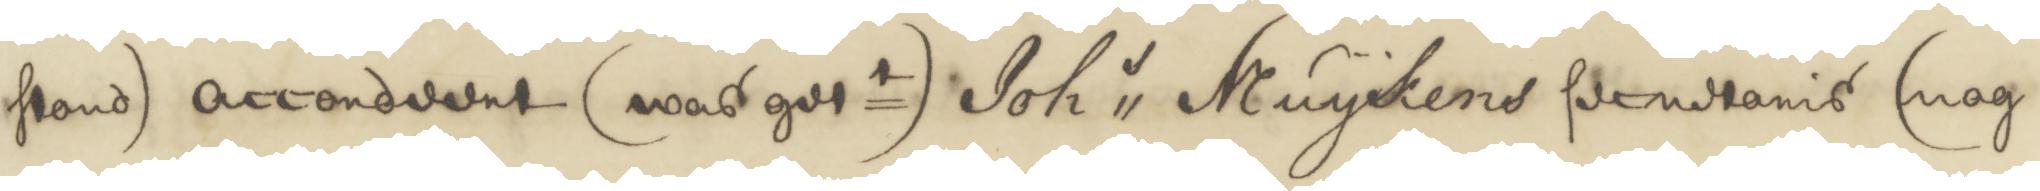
stond) accordeert (was get=t) Ioh„s Muijkens secretaris (nog
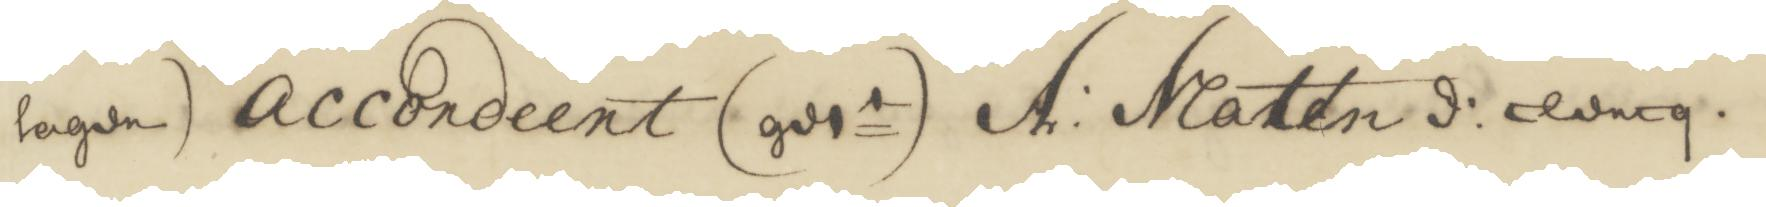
lager) Accordeert (get=t) A: Maten d: clercq.
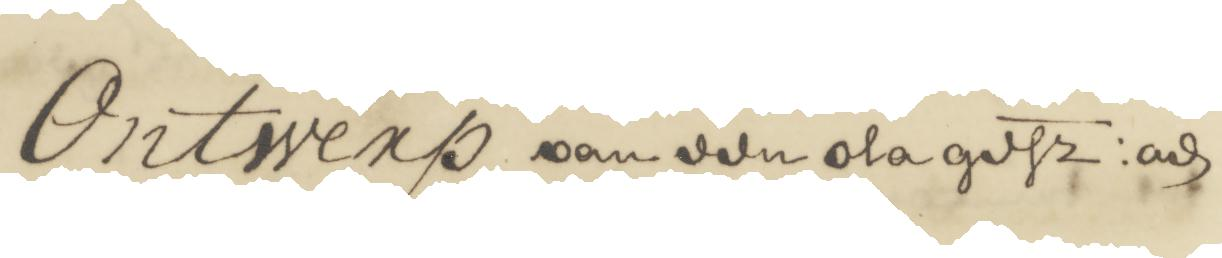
Ontwerp van een ola gesz: aen
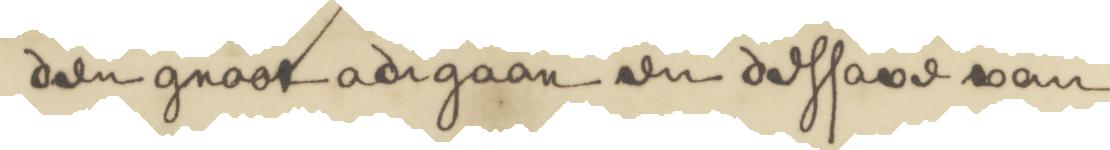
den groot adigaar en dessave van
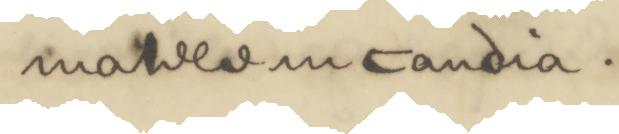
matele in candia.
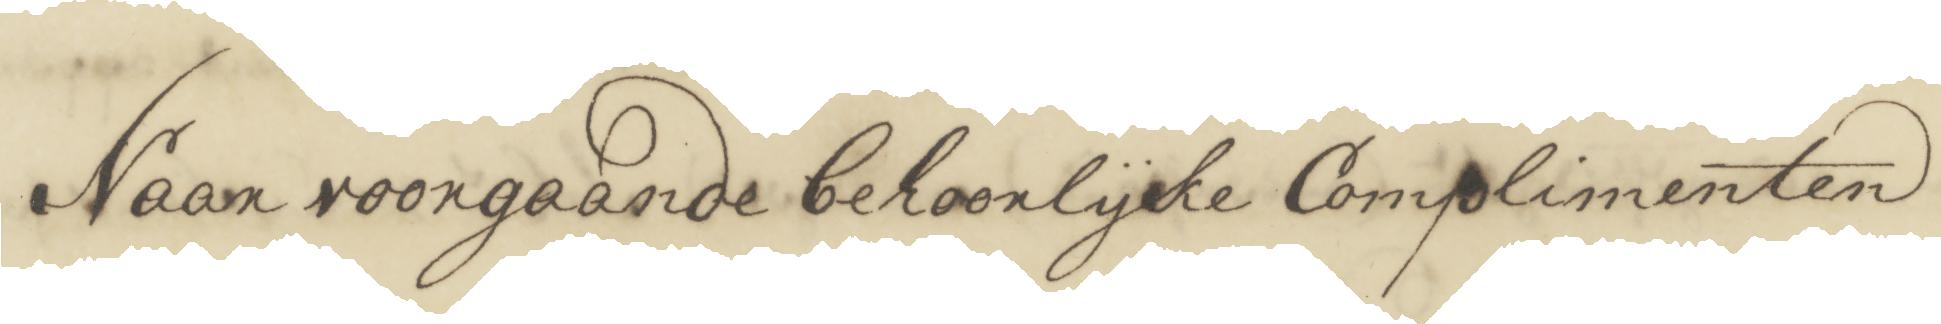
Naar voorgaande behoorlijke Complimenten
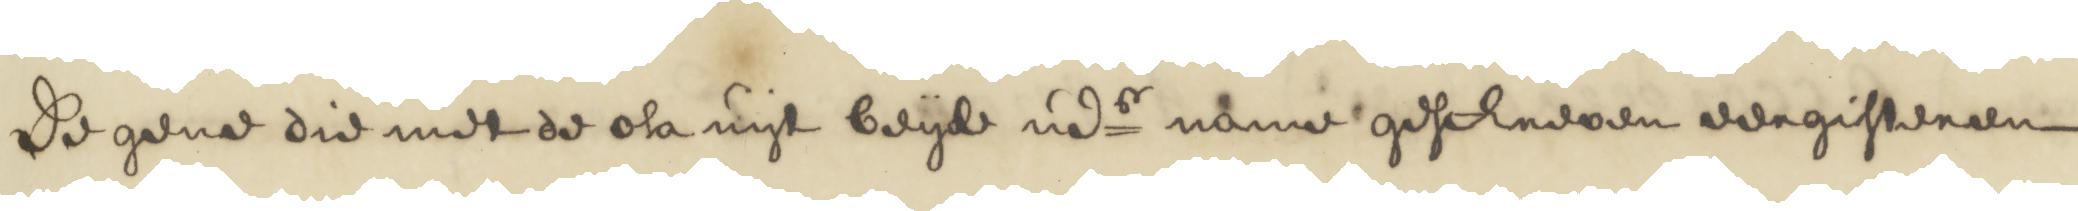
De gene die met de ola uijt beijde uE=s name geschreven eergisteren
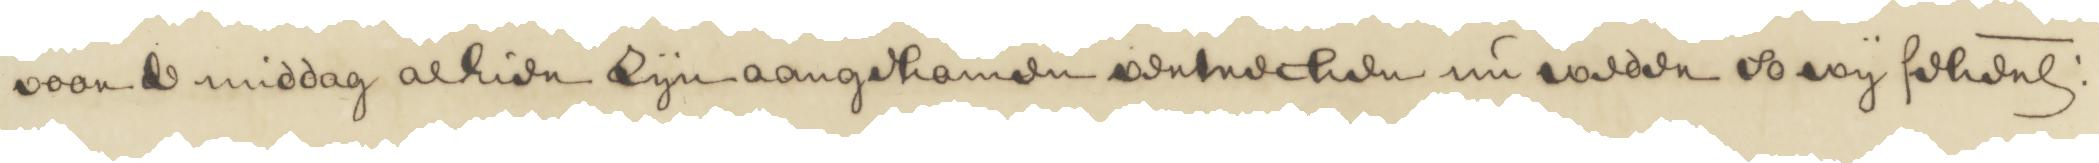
voor de middag alhier zijn aangekomen vertrecken nu weder so wij sekerlijk
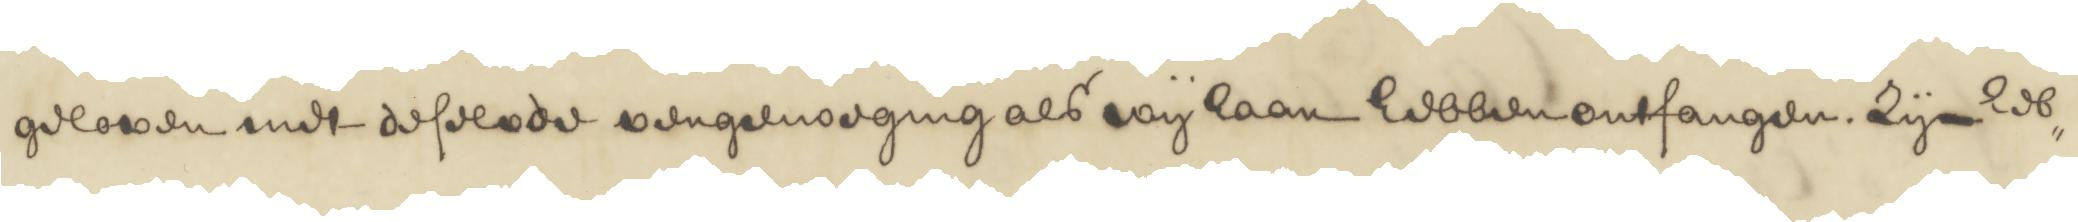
geloven met deselvde vergenoeging als wij haar hebben ontfangen. zij heb„
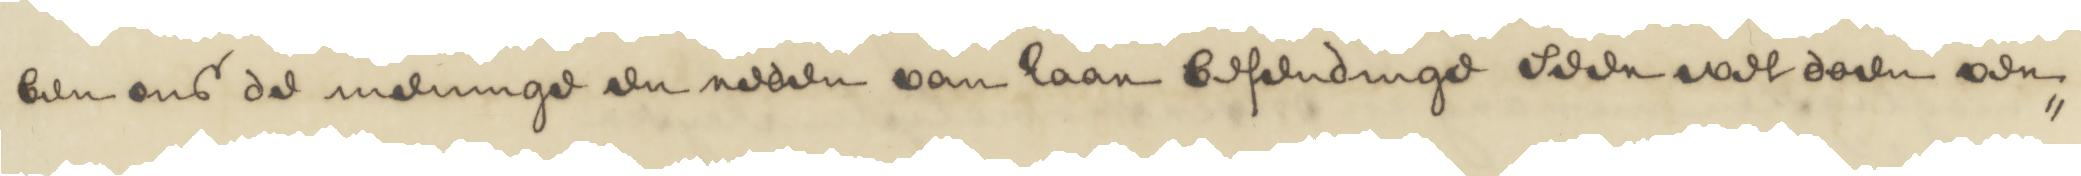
ben ons de meninge en reden van haar besendinge seer wel doen ver„
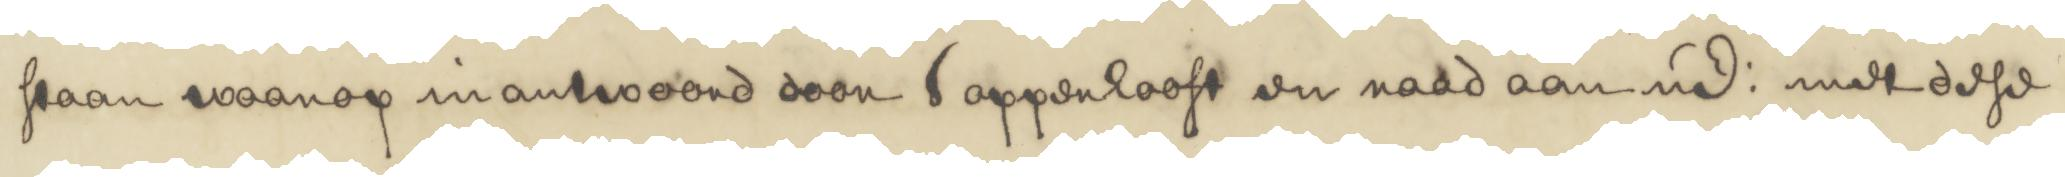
staan waarop in antwoord door 't opperhooft en raad aan uE: met dese
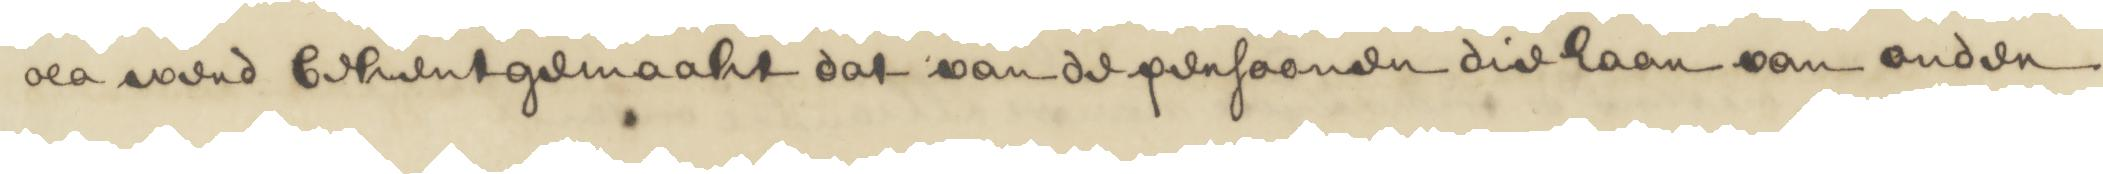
ola werd bekentgemaakt dat van de persoonen die haar van onder
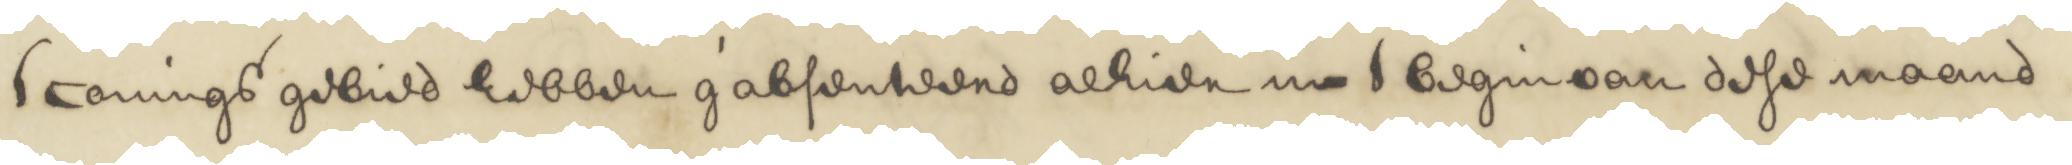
't conings gebied hebben g'absenteerd alhier in 't begin van dese maand
